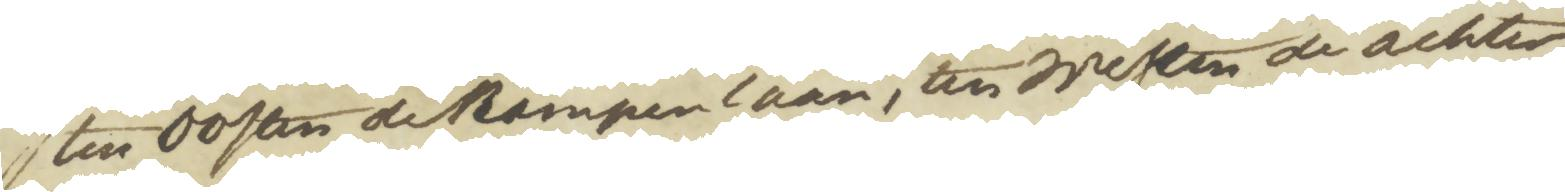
ten Ooften de Rompenlaan, ten Westen de achter
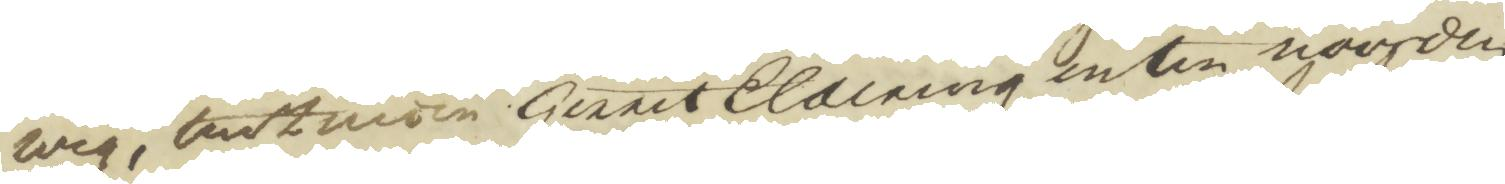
weg, ten zuiden Gerrit Eldering en ten noorden
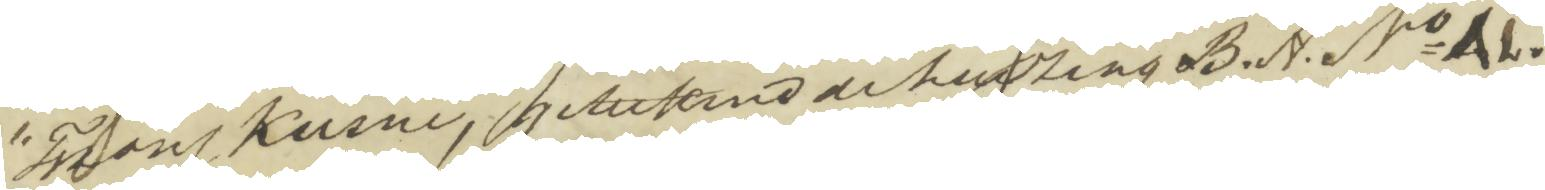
Frans Keeren, geteekend de huizing B.A. N=o 41.
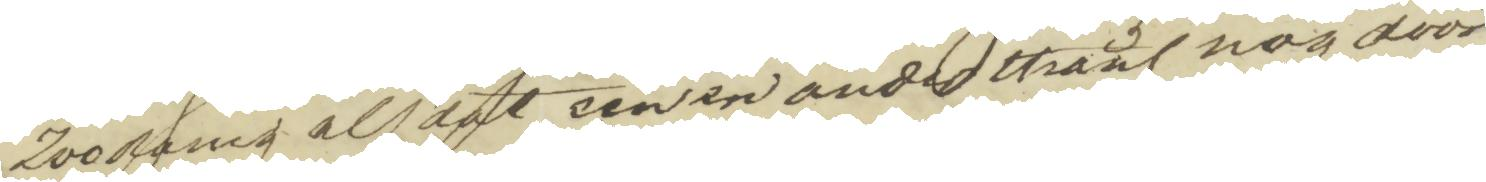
zoodanig als dat een en ander thans nog door
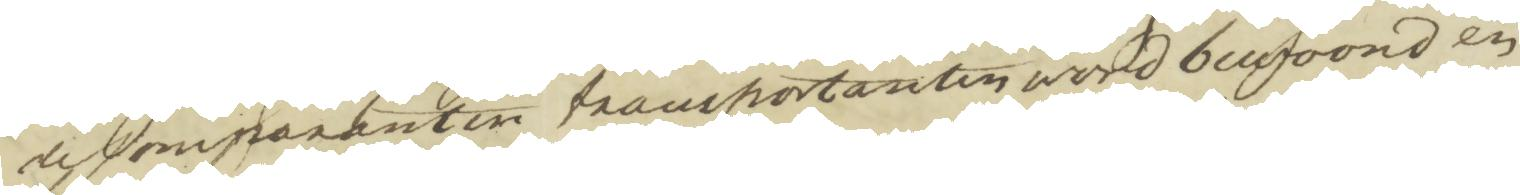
de Comparanten transportanten word bewoond en
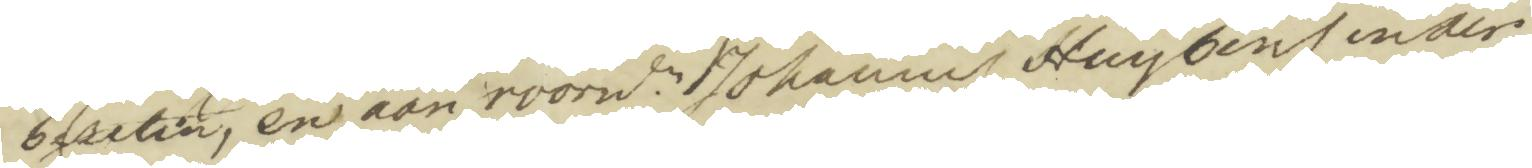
bezeten, en aan voorn.en Johannes Huybers in der
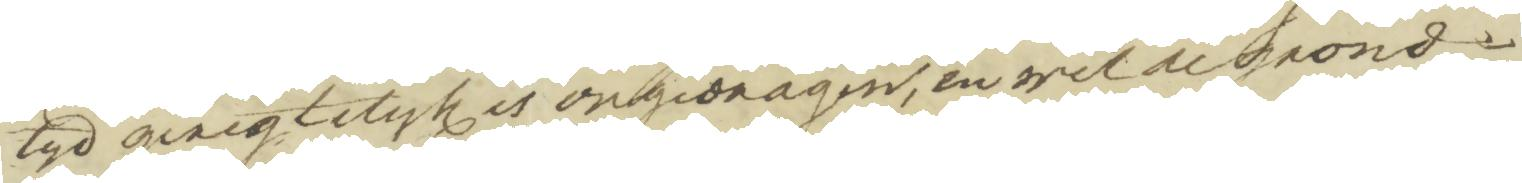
tyd gerigtelyk is opgedragen, en wel de gronde
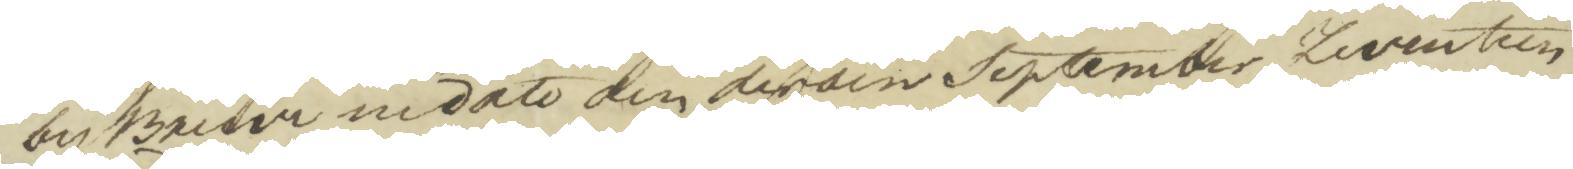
by Brevet in dato den derden September Zeventien
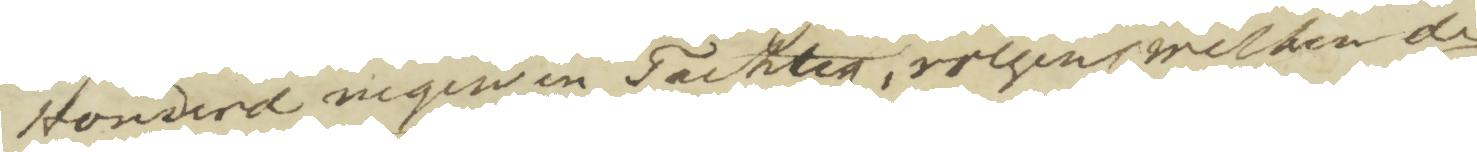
Honderd negen en Tachtig, volgens welken de
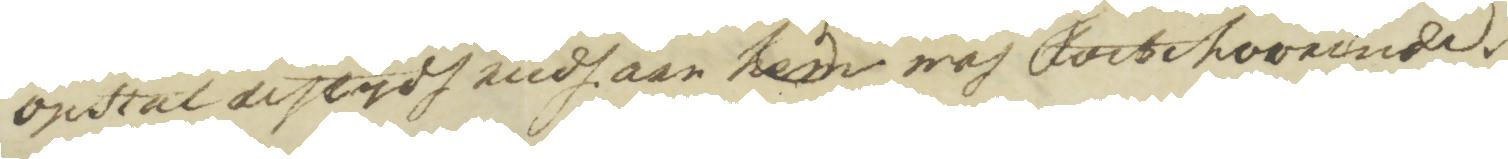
opstal destyds reeds aan hem was toetehoorende.
